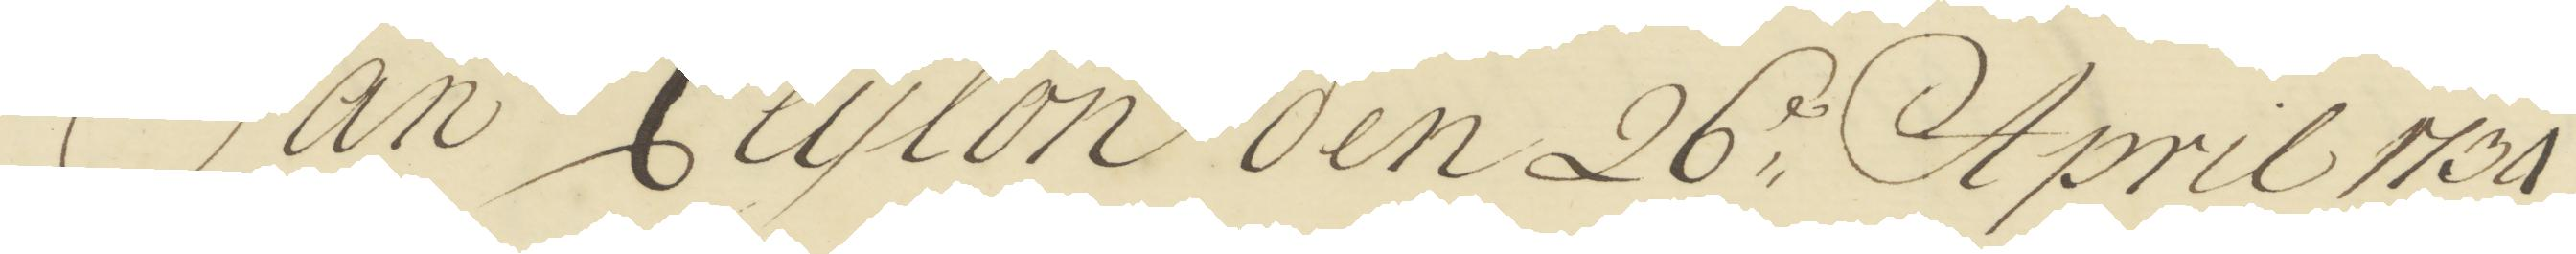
Van Ceylon den 26„e April 1734
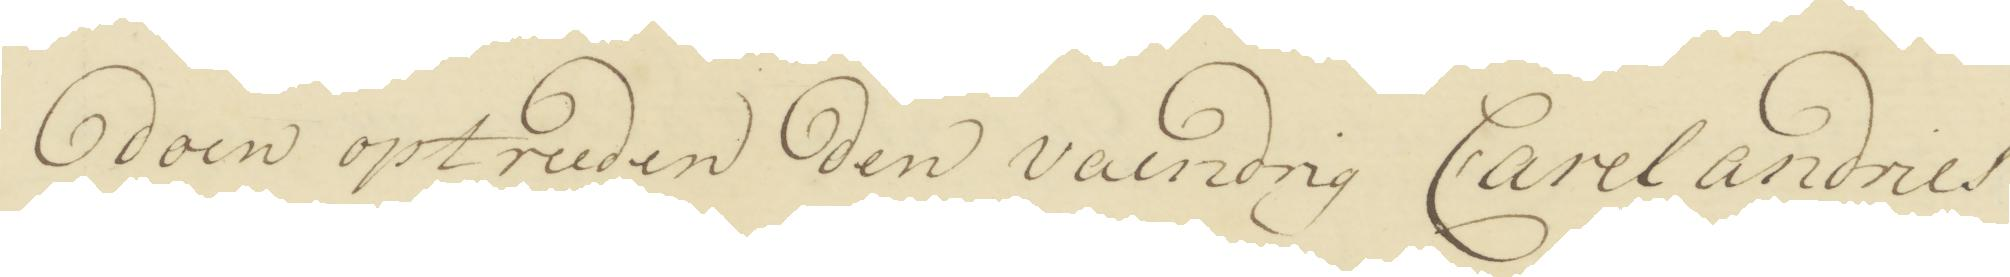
doen optreeden den vaindrig Carel andries
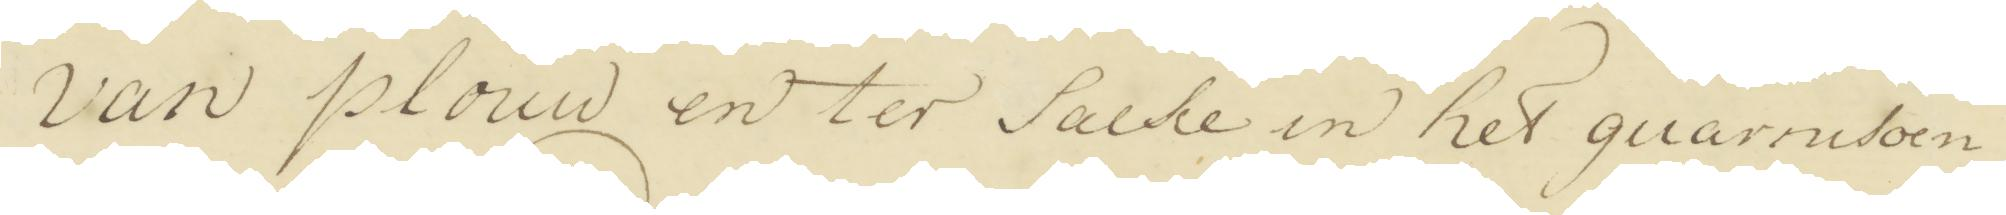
van plouw en ter Saeke in het guarnisoen
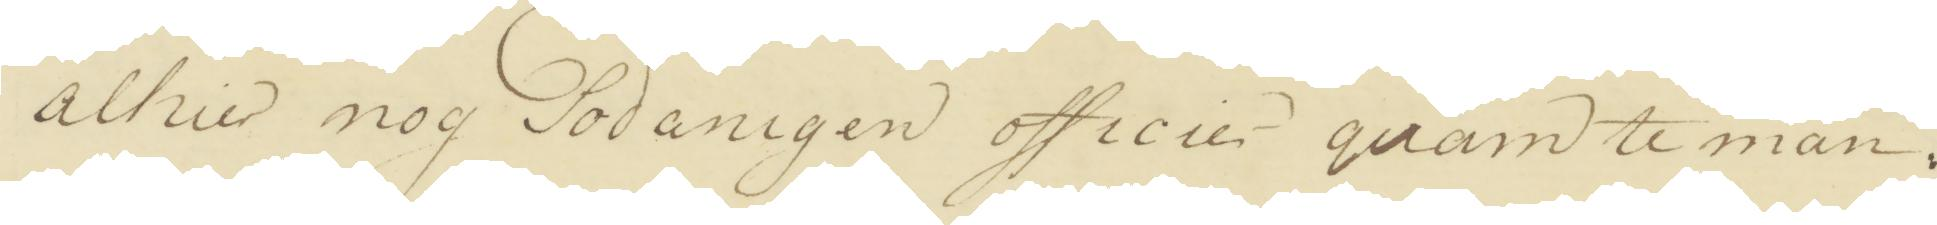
alhier nog Sodanigen officier quam te man„
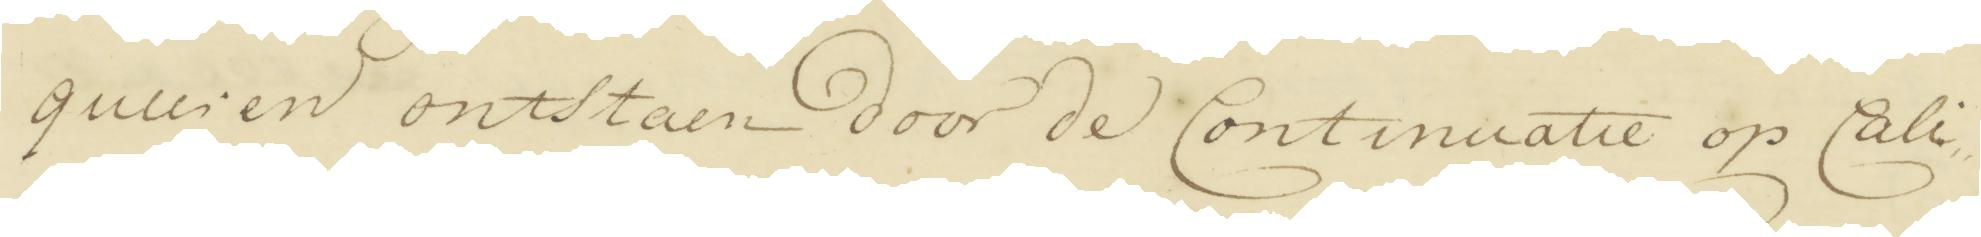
queeren ontstaen door de Continuatie op Cali„
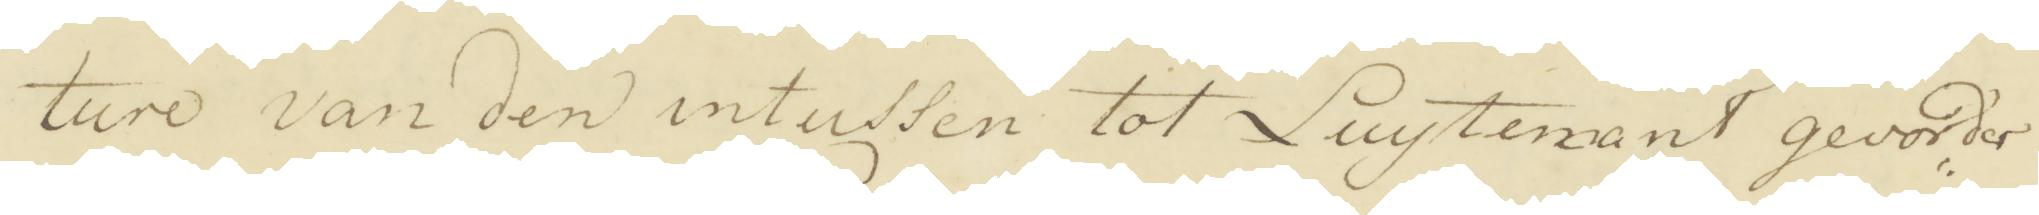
ture van den intussen tot Luytenant gevorder„
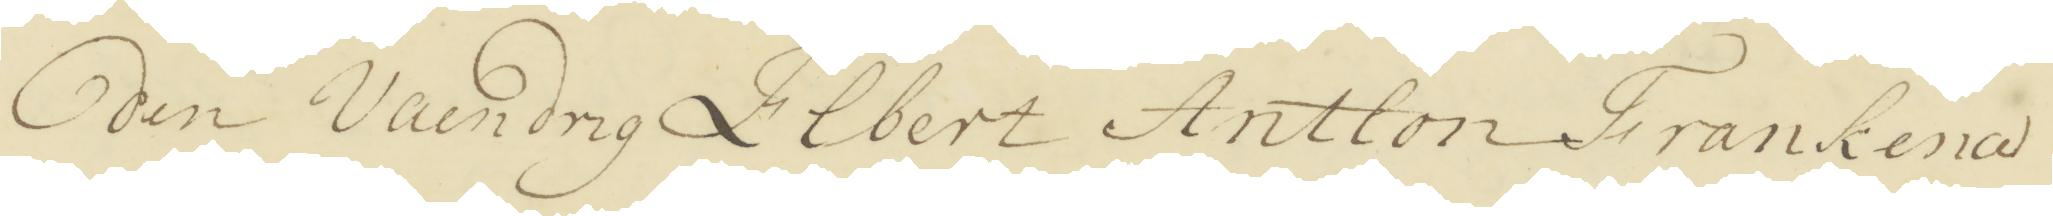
den Vaendrig Elbert Anthon Frankena
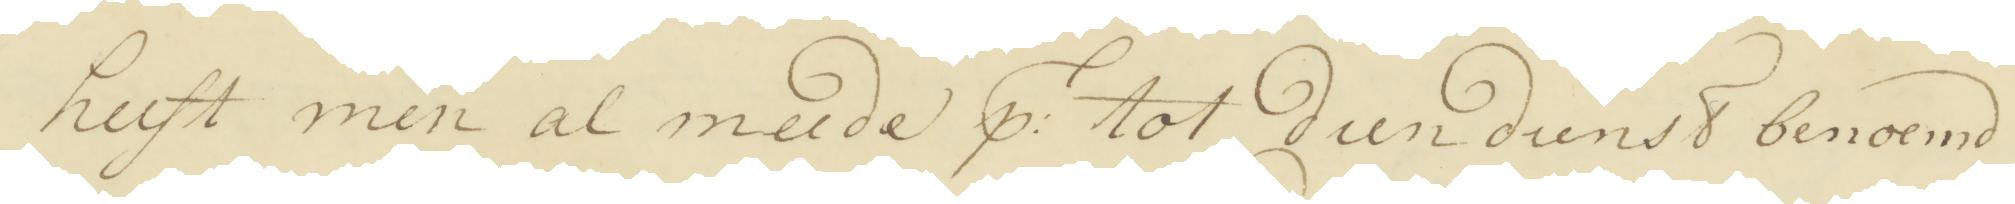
heeft men al meede p:l tot dien dienst benoemd
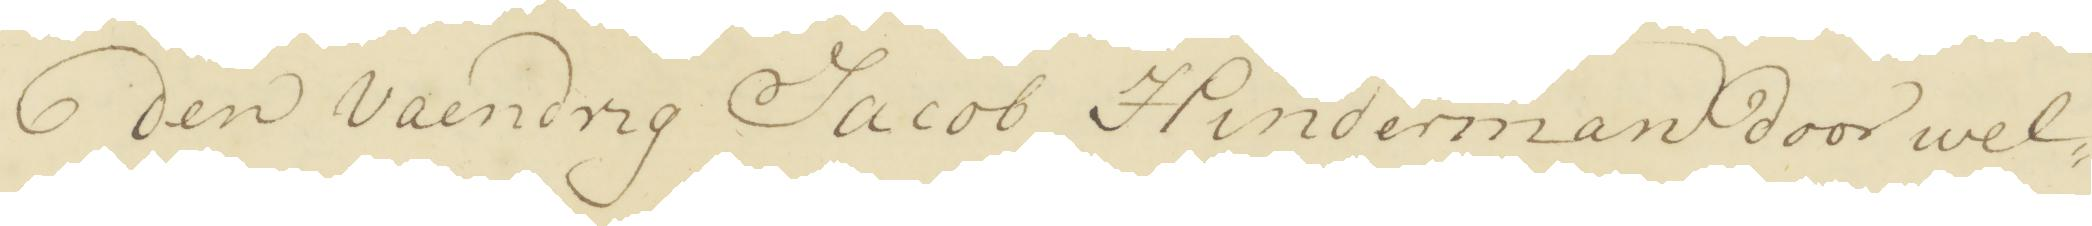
den vaendrig Iacob Hinderman door wel„
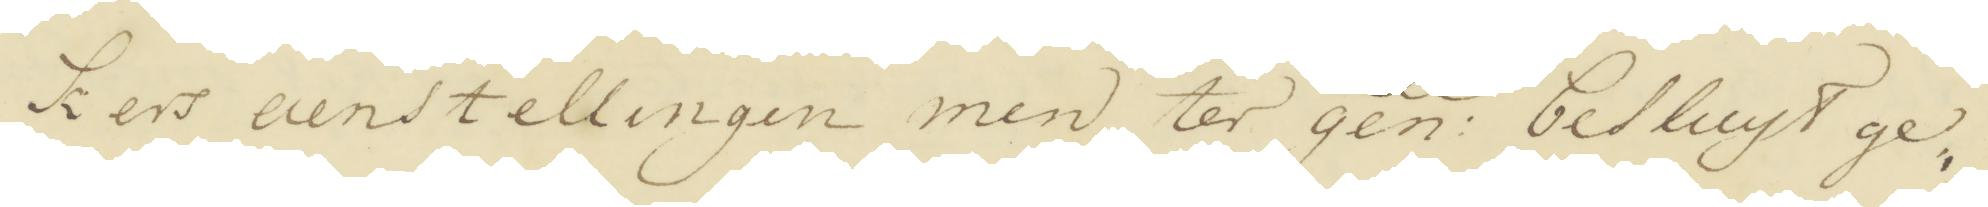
kers aenstellingen men ter gen:e besluijt ge„
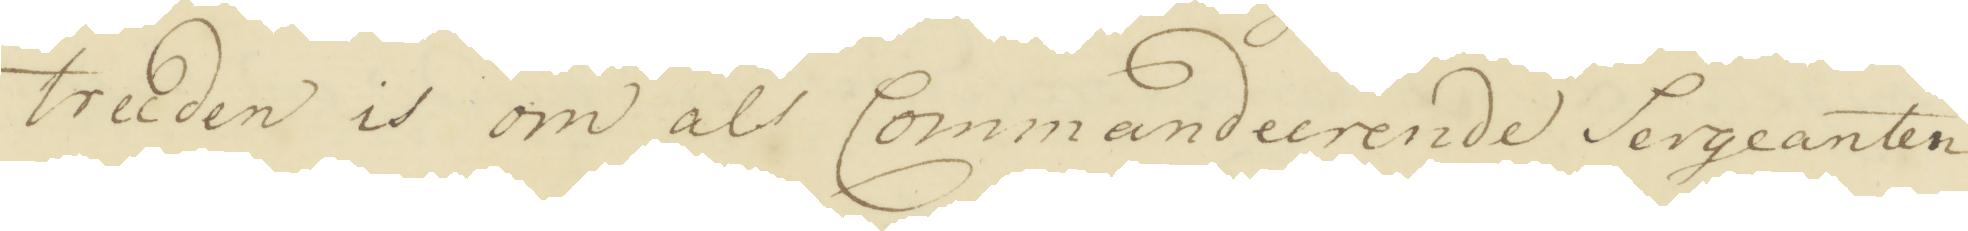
treeden is om als Commandeerende Sergeanten
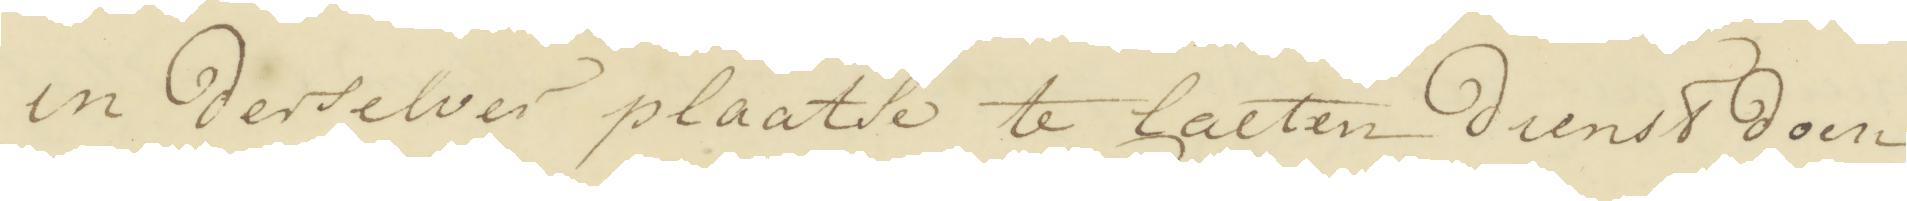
in derselver plaatse te laeten dienst doen
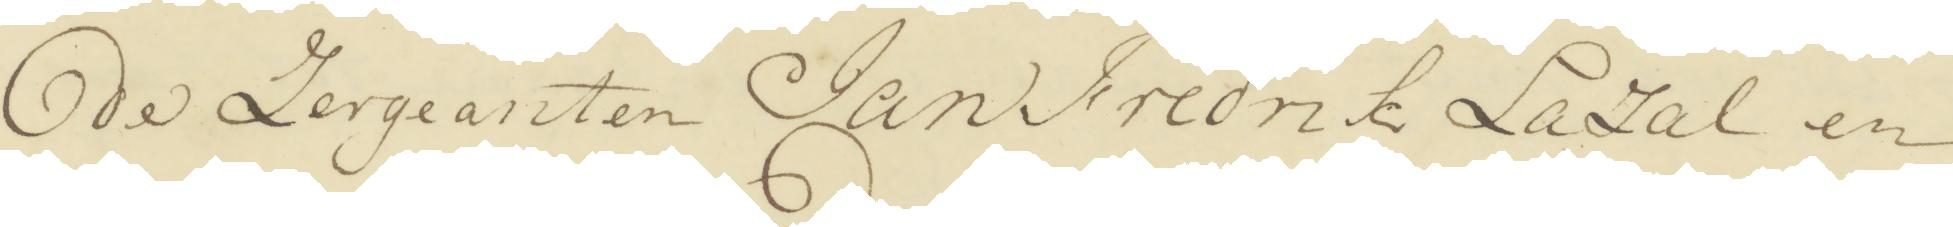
de Zergeanten Ian Fredrik Lazal en
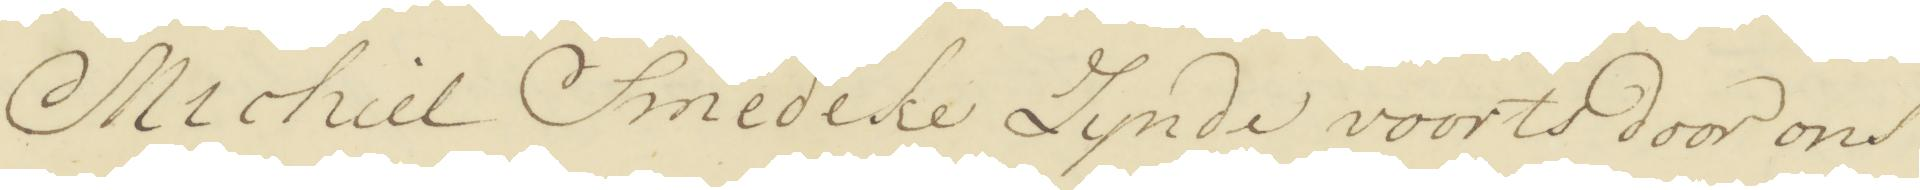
Michiel Smedeke Zynde voorts door ons
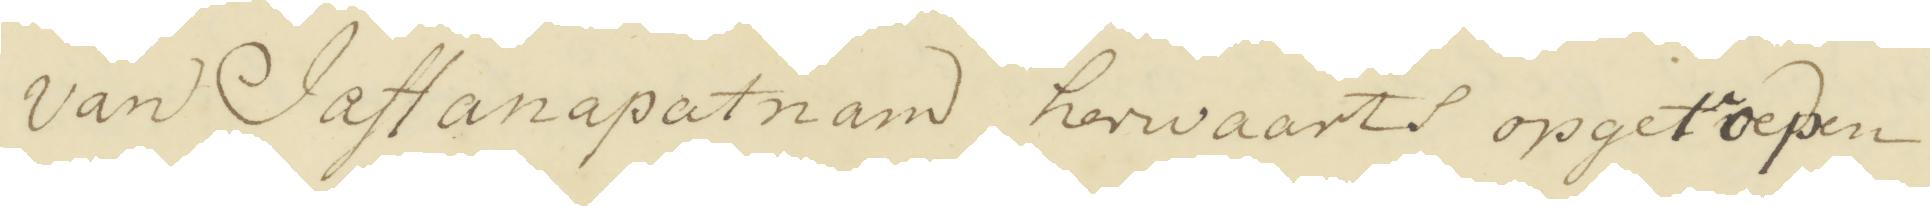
van Iaffanapatnam herwaarts opgeroepen
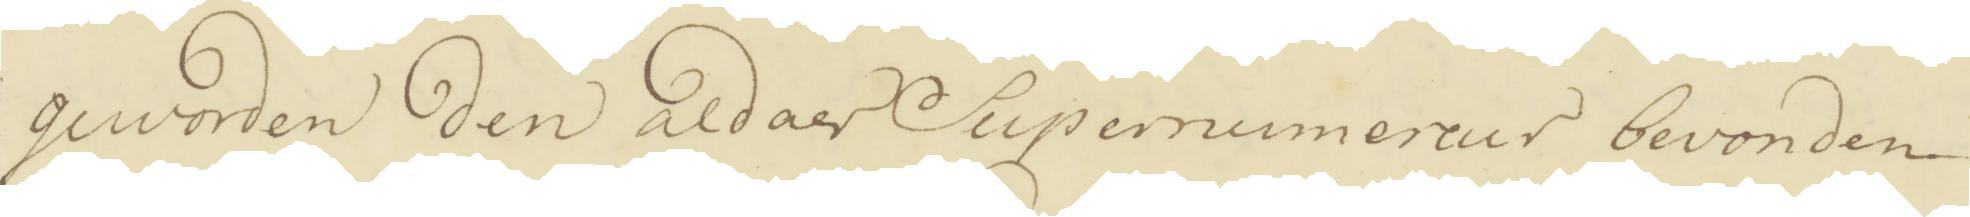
geworden den aldaer Supernumereur bevonden
